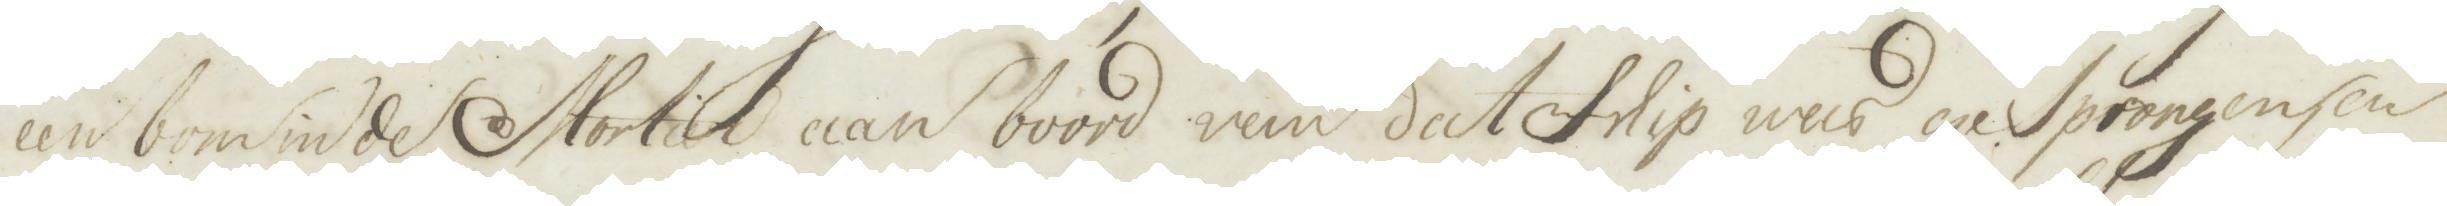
een bom in de Mortier aan boord van dat schip was gesprongen, en
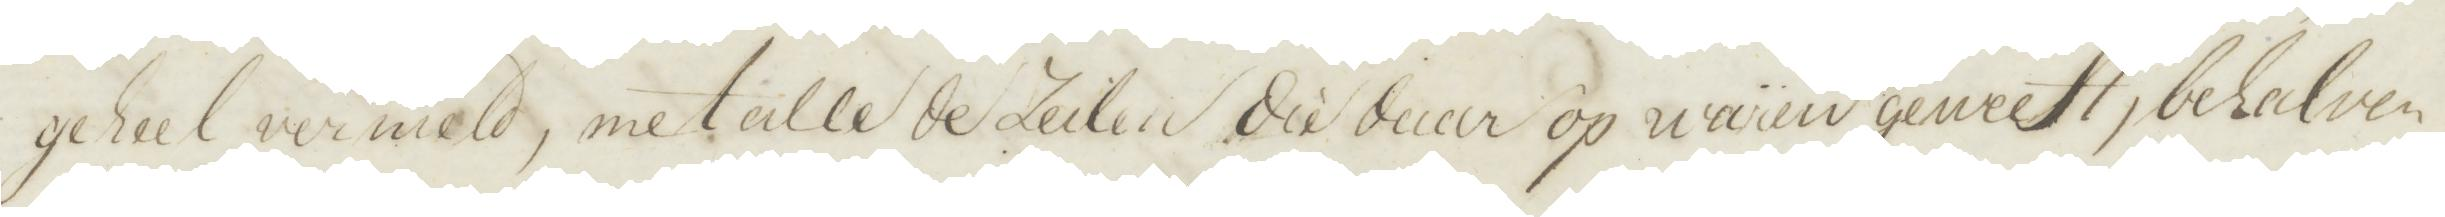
geheel vernield, met alle de zeilen die daar op waren geweest, behalven
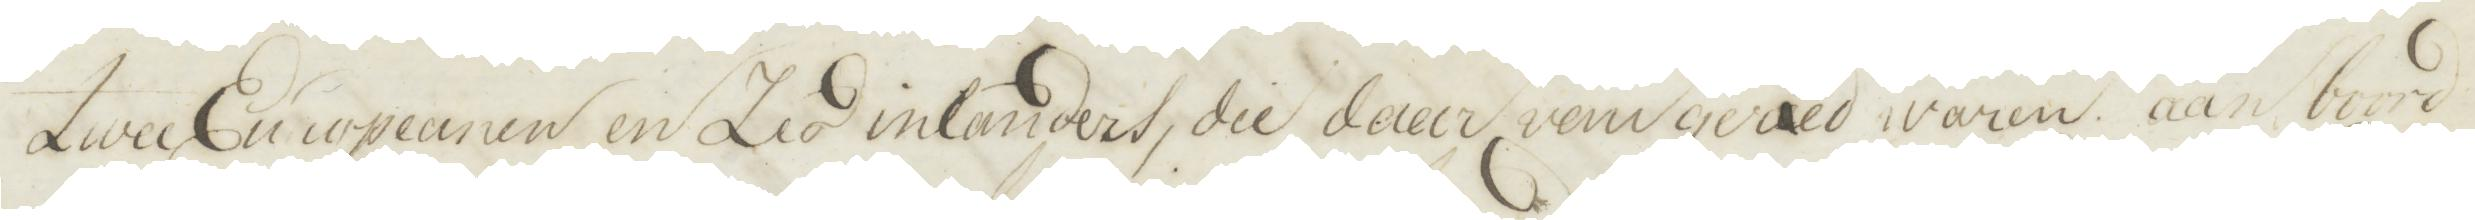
twee Europeanen en Zzes inlanders, die daar van gered waren aan boord
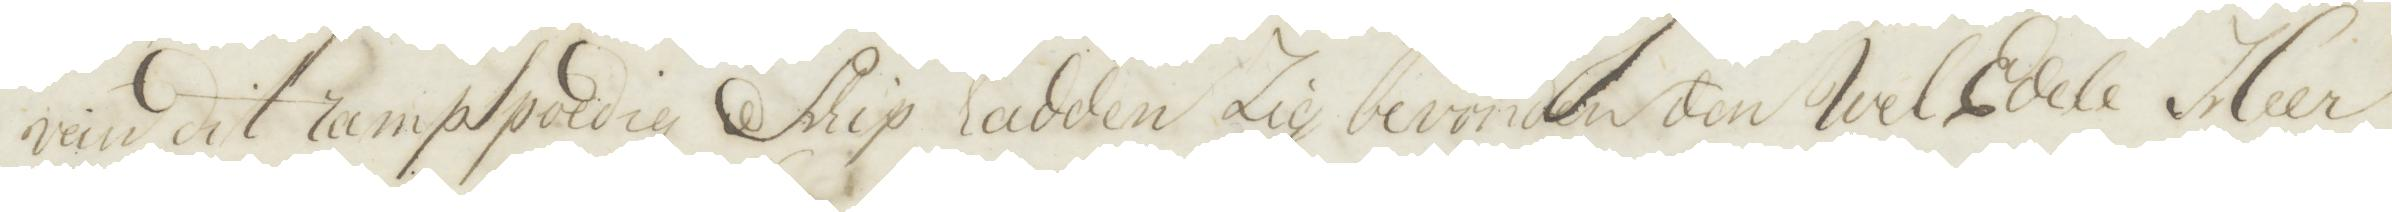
van dit rampspoedig schip hadden zig bevonden den wel Edele Heer
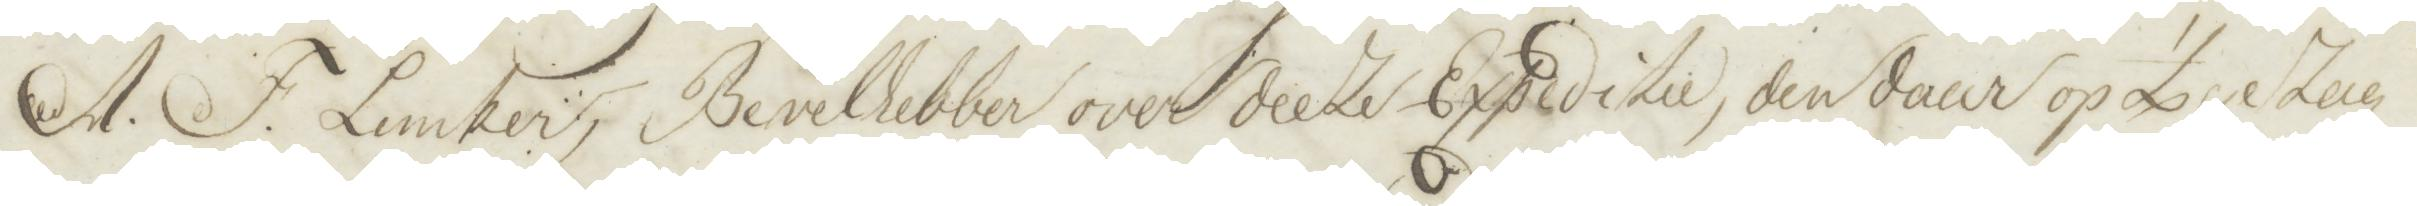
A. F. Lemker, Bevelhebber over deeze Expeditie, den daar op 't gezag
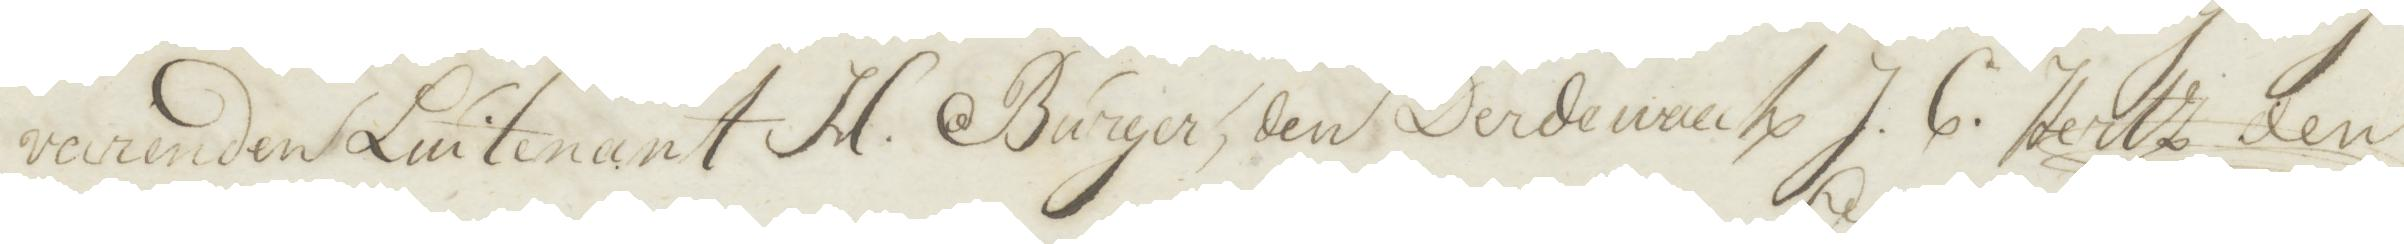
varenden Luitenant H. Burger, den Derde waak J. C. Hertz den
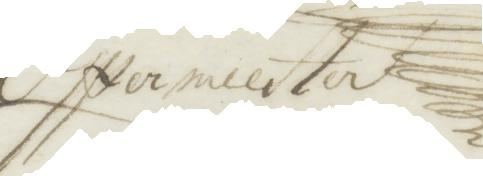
Oppermeester
